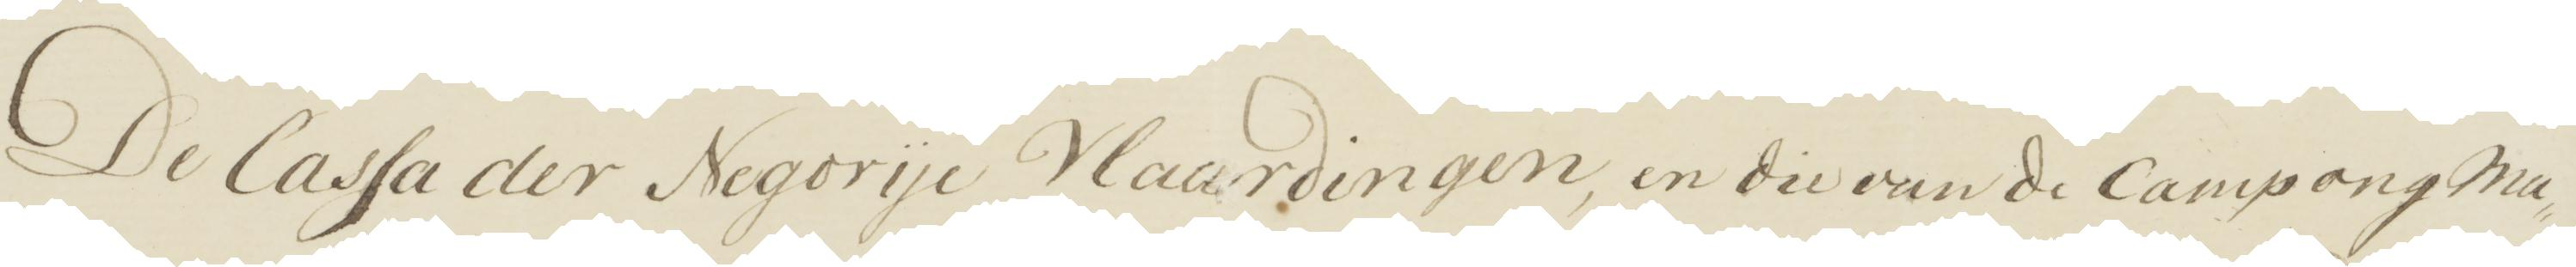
De Cassa der Negorije Vlaardingen, en die van de Campong ma„
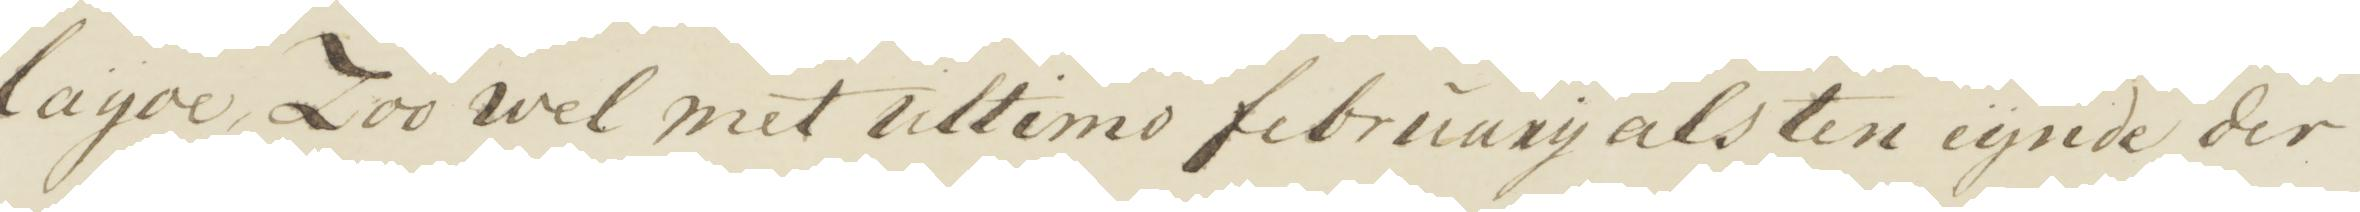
laijoe, zoo wel met ultimo februarij als ten eijnde der
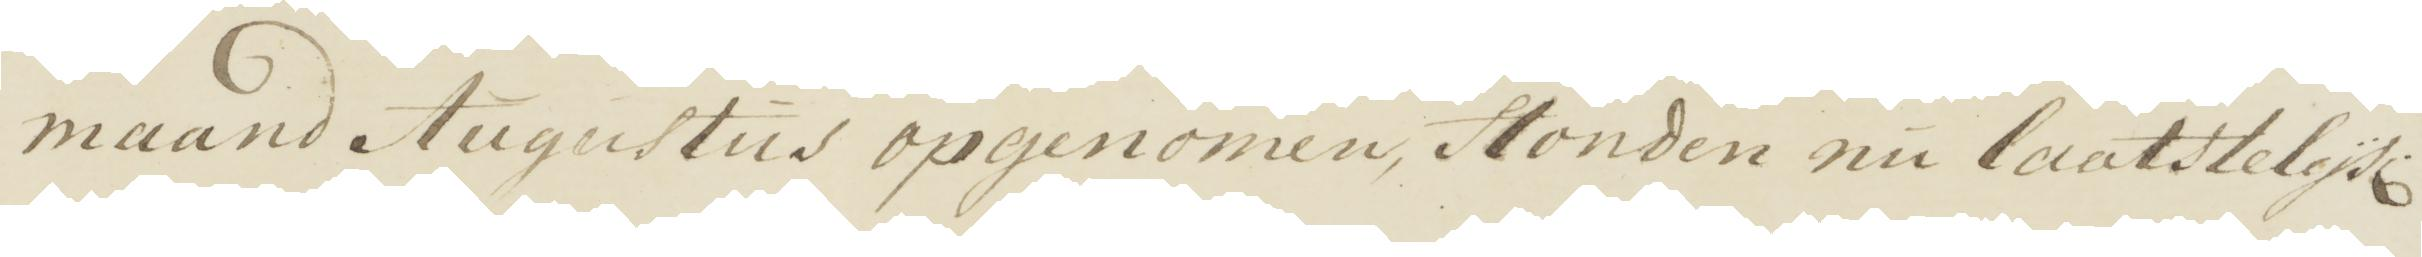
maand Augustus opgenomen, stonden nu laatstelijk
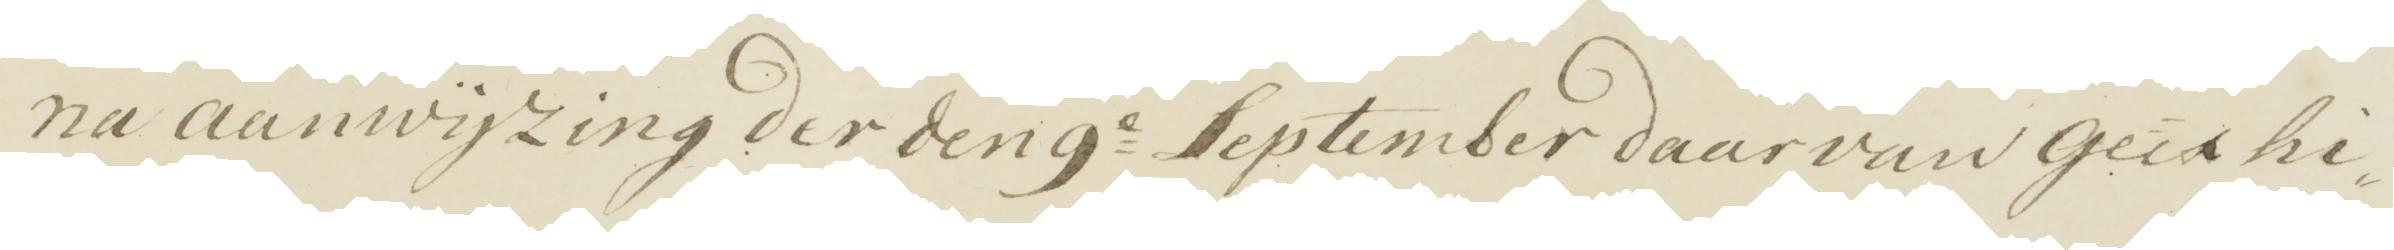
na aanwijzing der den 9=e September daar van geixhi„
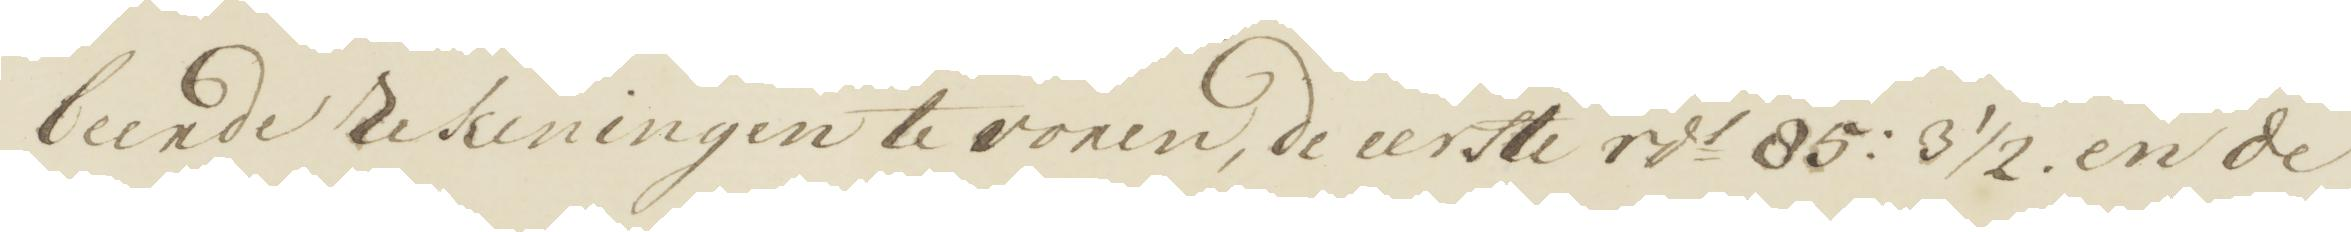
beerde rekeningen te voren, de eerste rd=s 85: 3½. en de
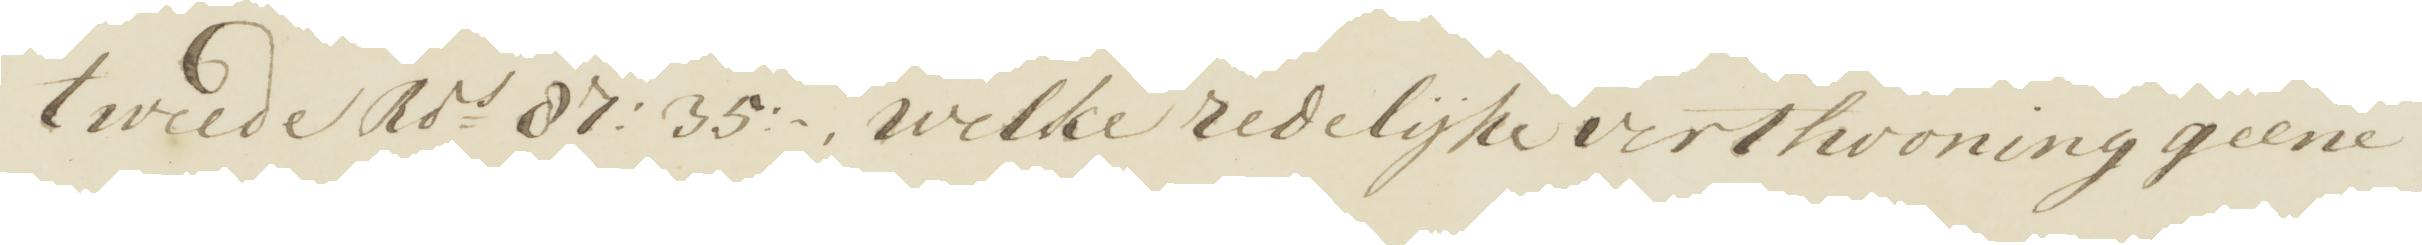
tweede Rd=s 87:35:–, welke redelijke verthooning geene
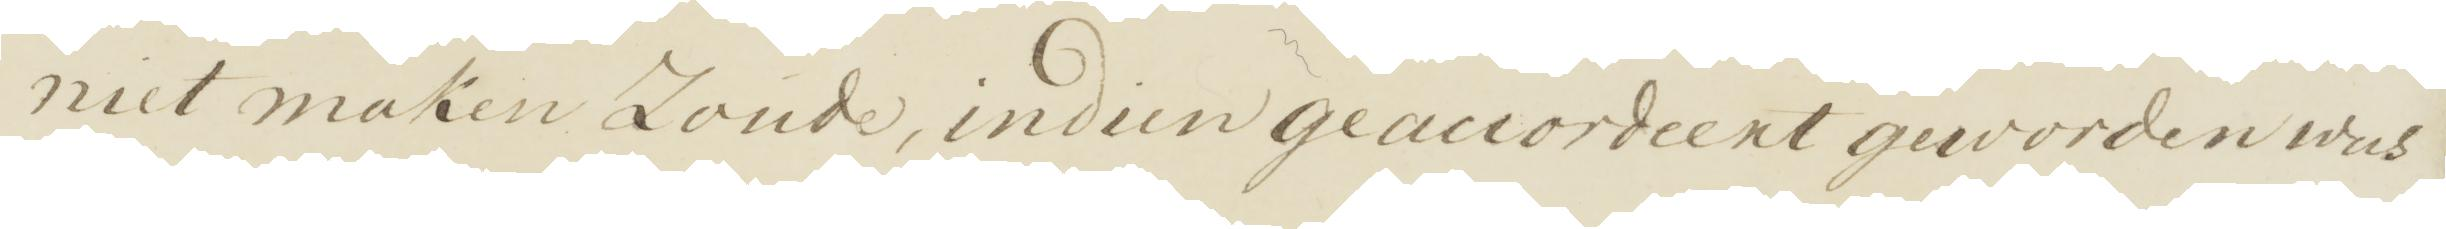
niet maken zoude, indien geaccordeert geworden was
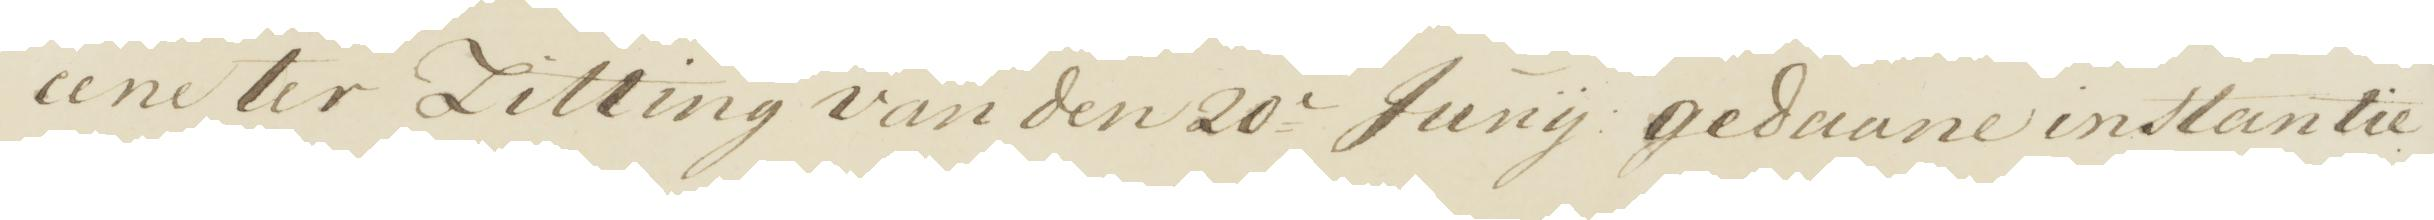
eene ter zitting van den 20=e Iunij: gedaane instantie
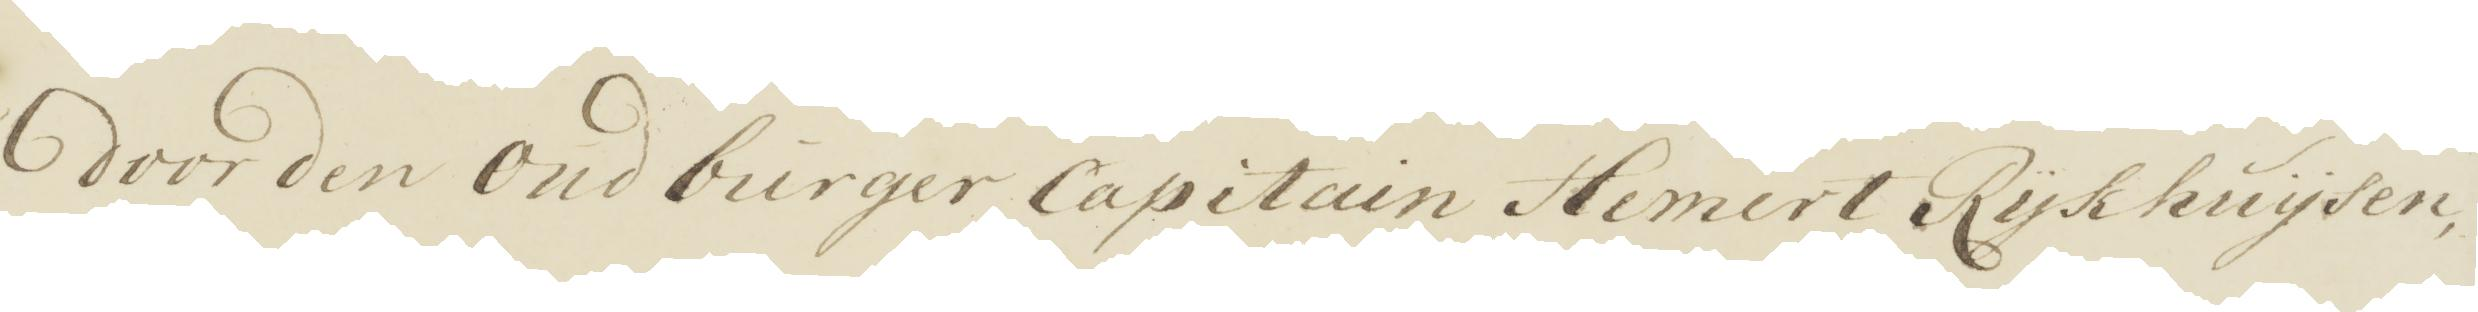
door den oud burger Capitain Hemert Rijkhuijsen,
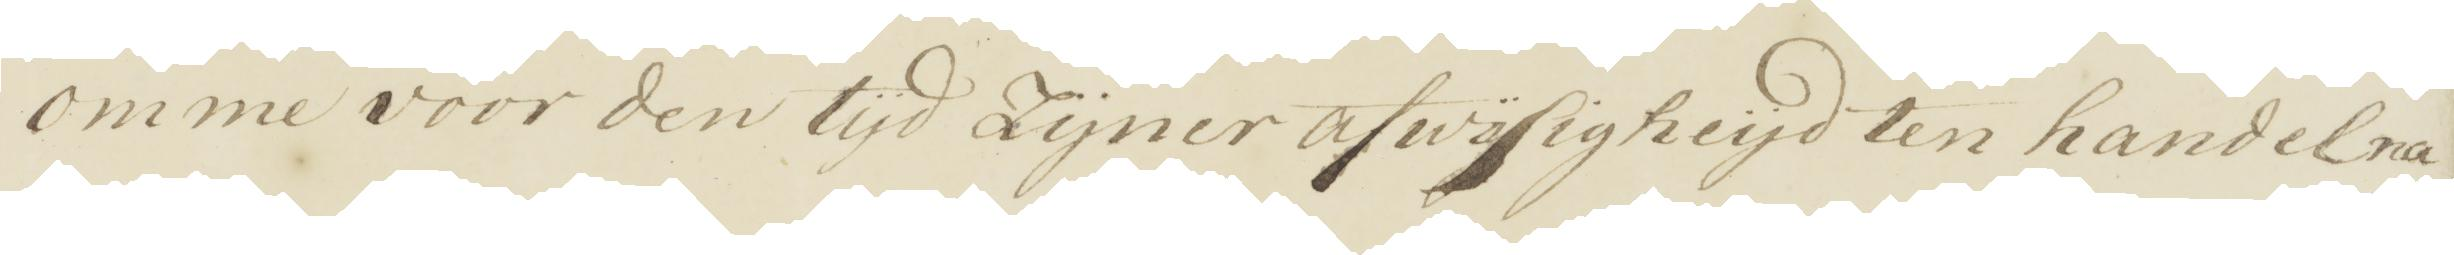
omme voor den tijd zijner afwäsigheijd ten handel na
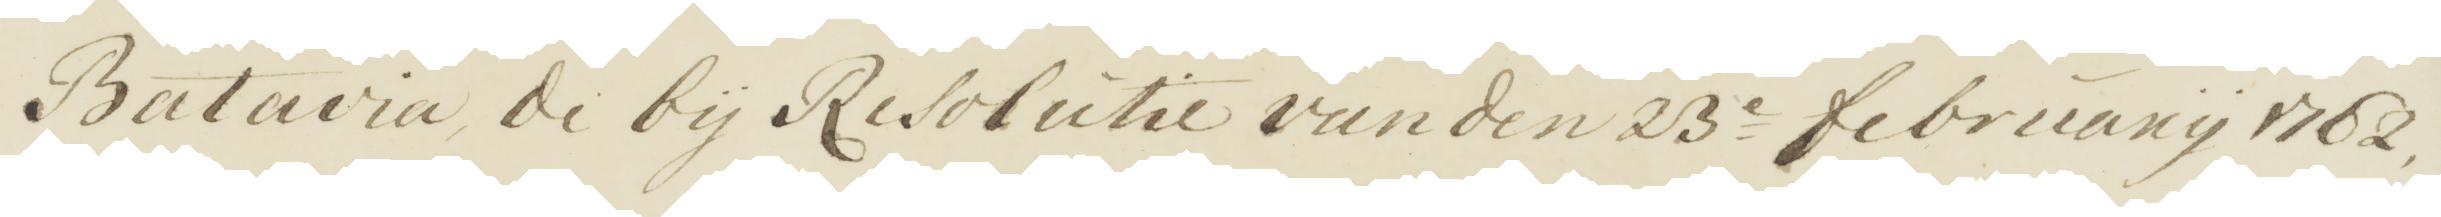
Batavia, di bij Resolutie van den 23=e februarij 1762,
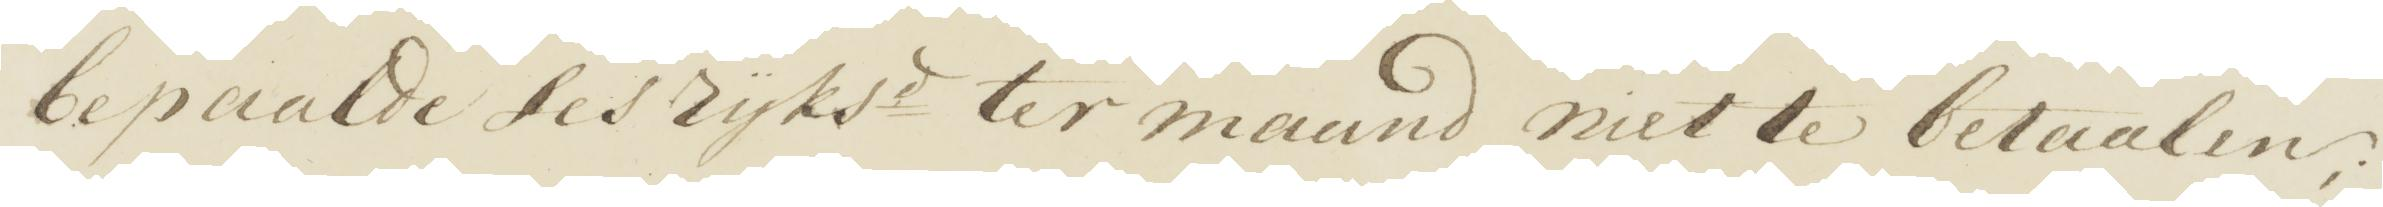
bepaalde ses rijks=d ter maand niet te betaalen;
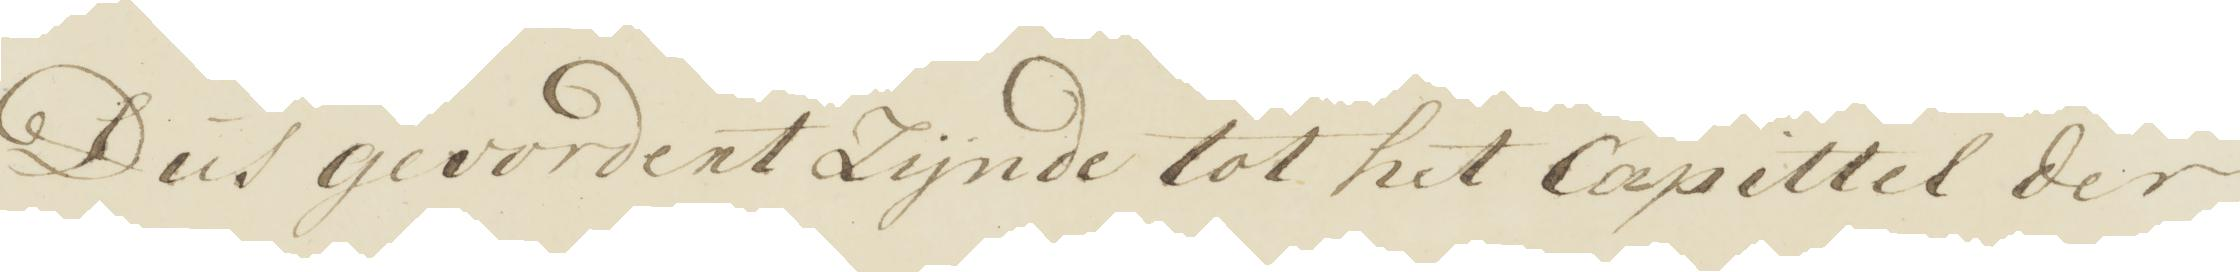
Dus gevordert zijnde tot het Capittel der
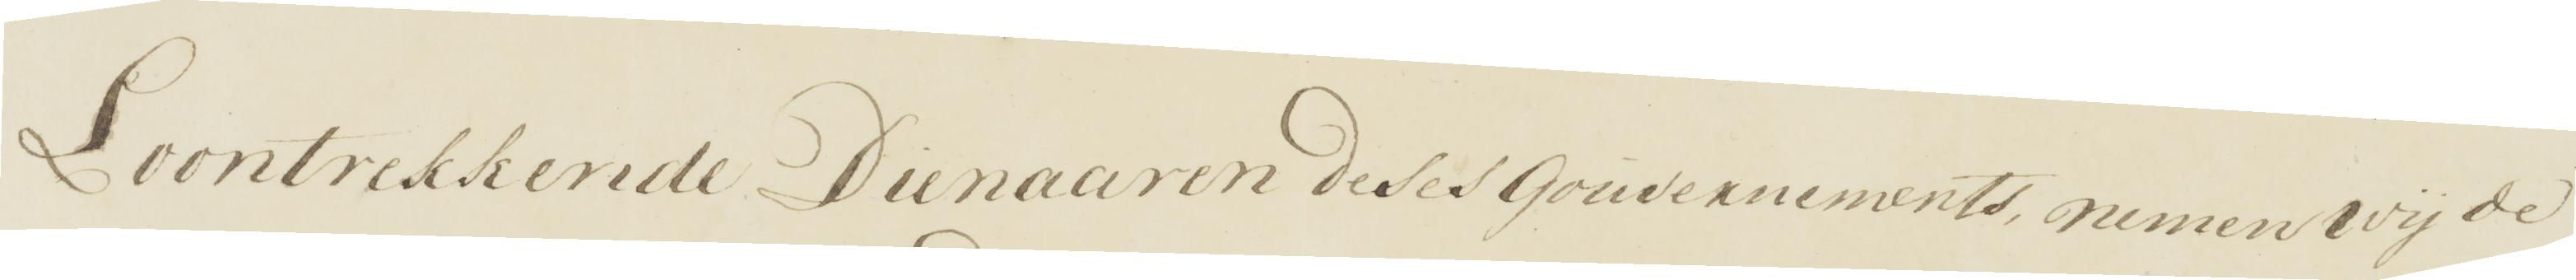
Loontrekkende Dienaaren deses gouvernements, nemen wij de
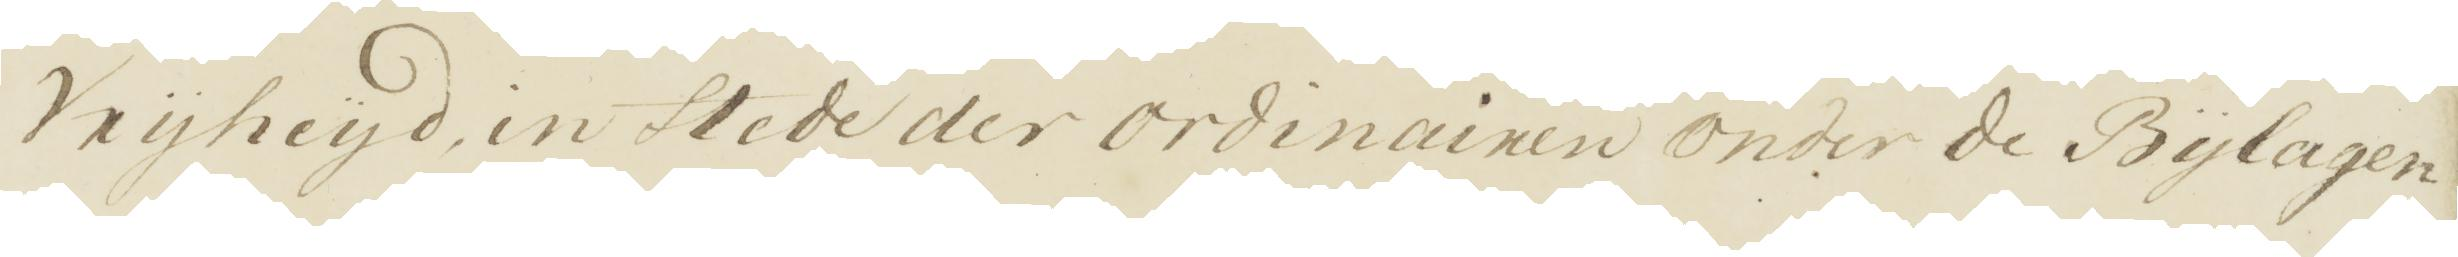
Vrijheijd, in stede der ordinairen onder de Bijlagen
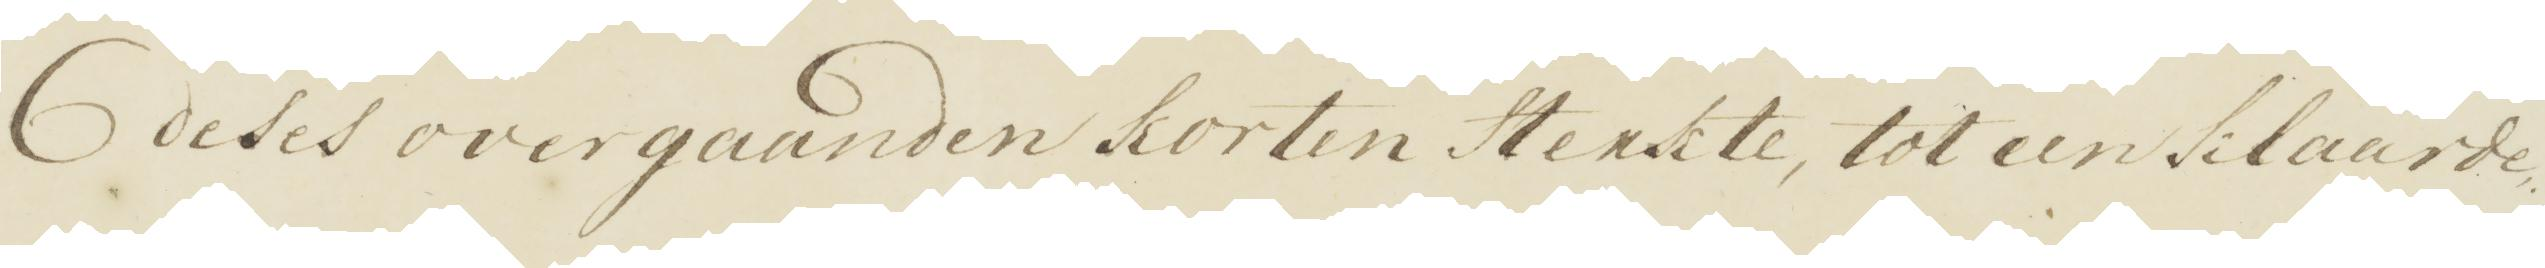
deses overgaanden korten sterkte, tot een klaarde„
